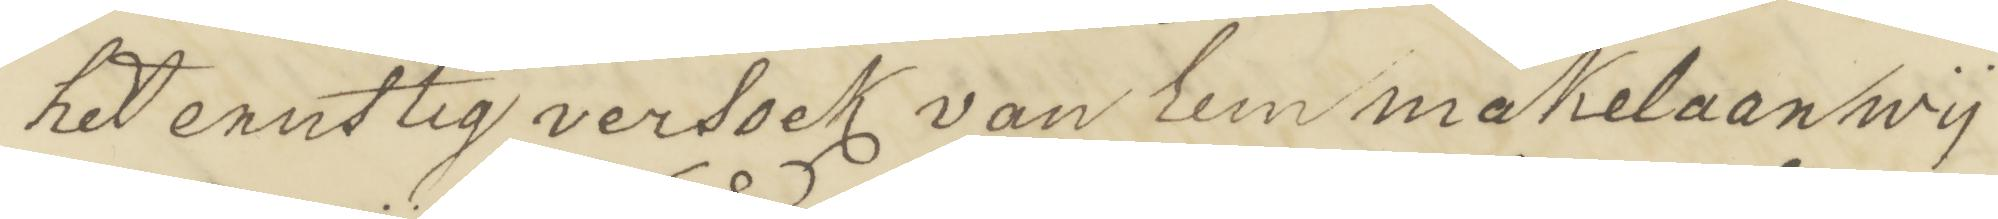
het ernstig versoek van hem makelaar wij
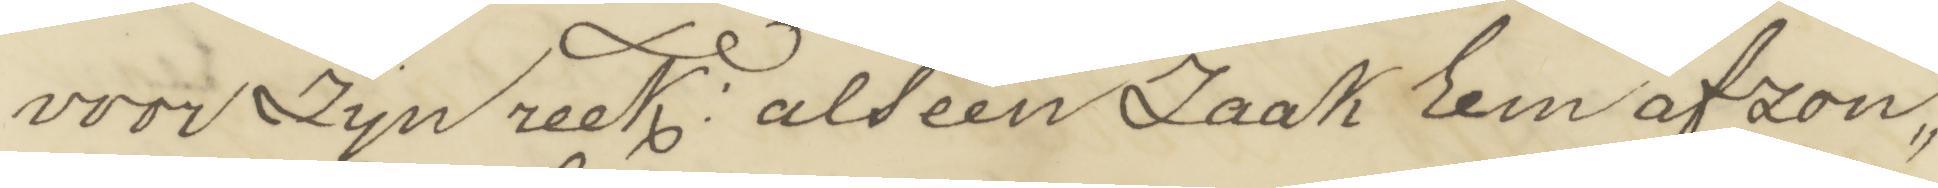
voor zijn reek: als een zaak hem afzon„
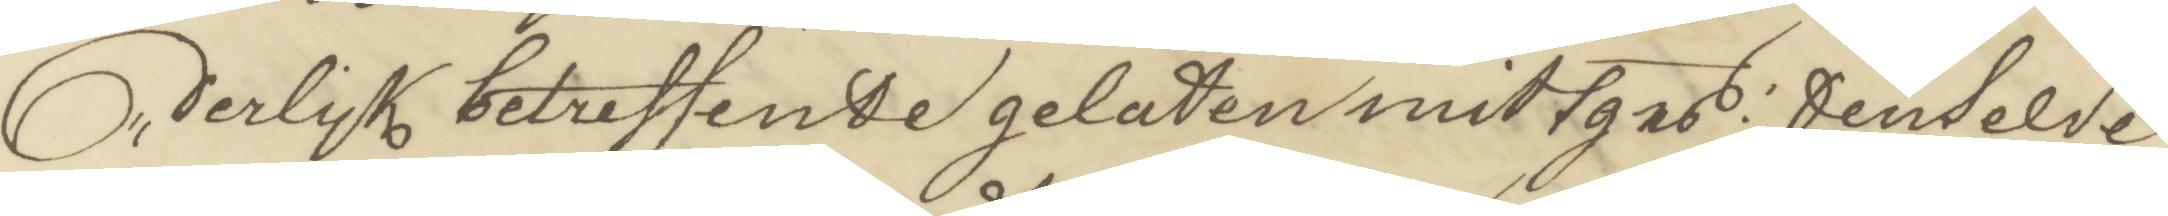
derlijk betreffende gelaten mitsgrs: denselve
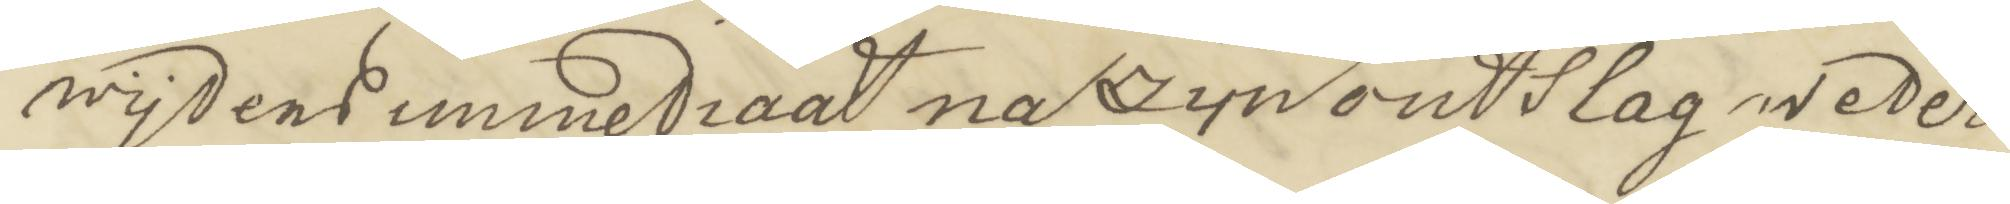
wijders immediaat na zijn ontslag weder
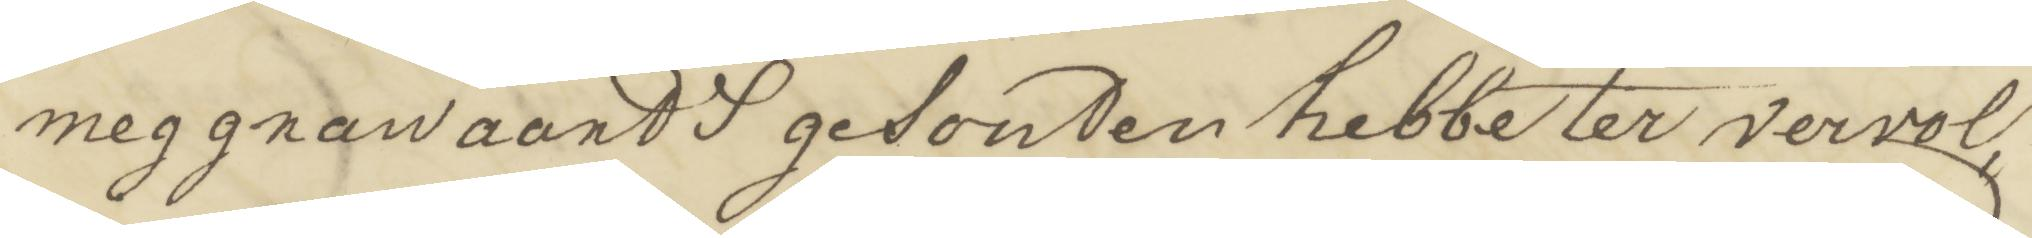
meggrawaards gesonden hebbe ter vervol
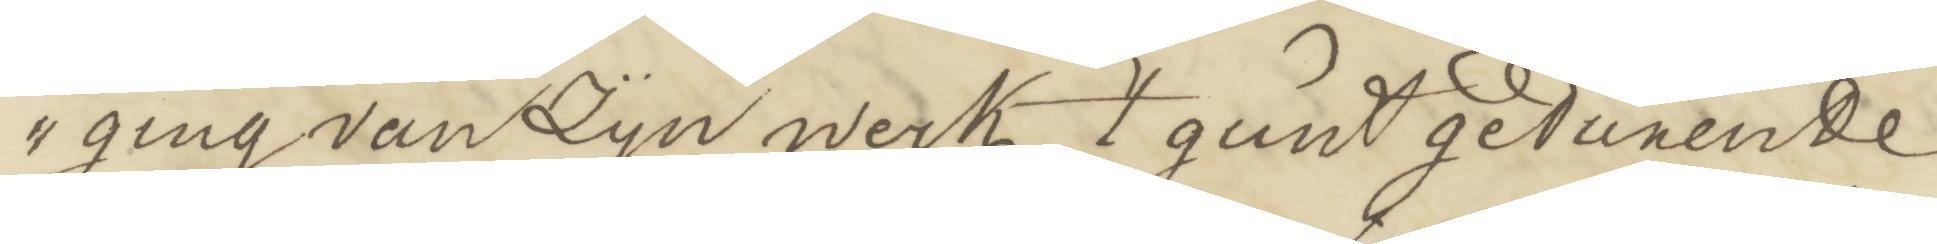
„ging van zijn werk ’t gunt gedurende
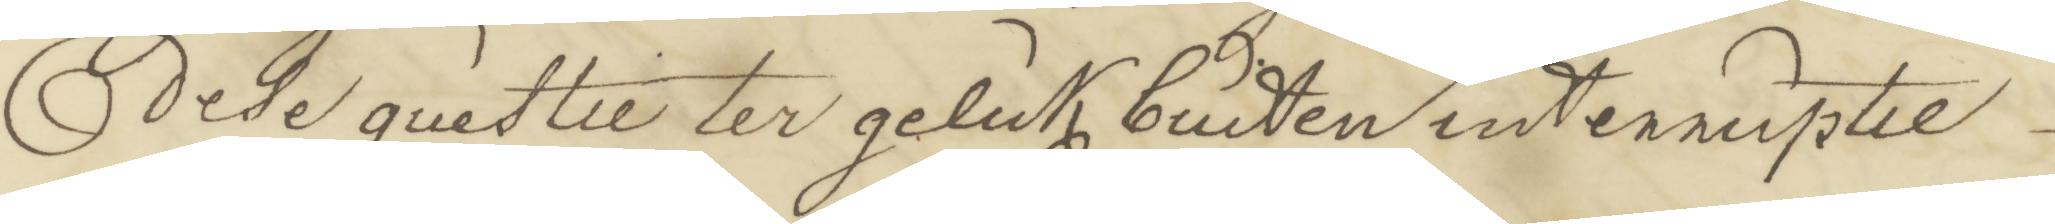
dese questie ter geluk buiten interruptie
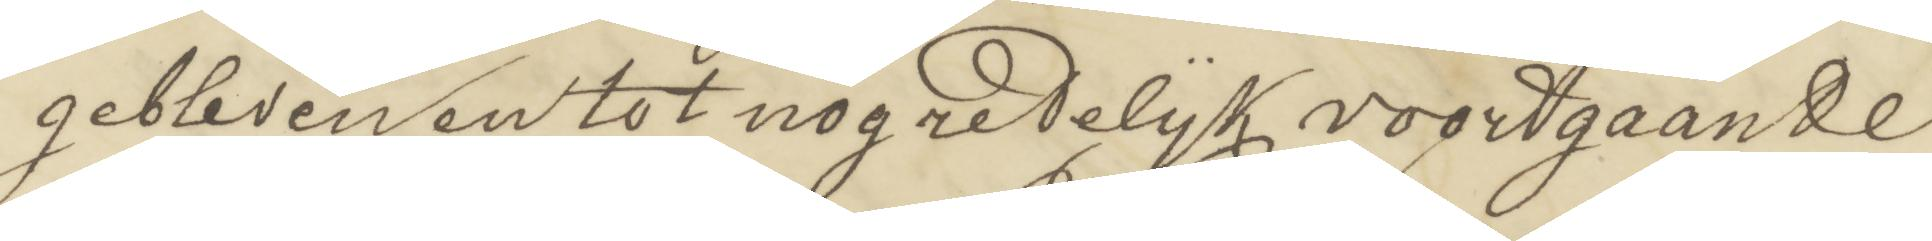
gebleven en tot nog redelijk voortgaande
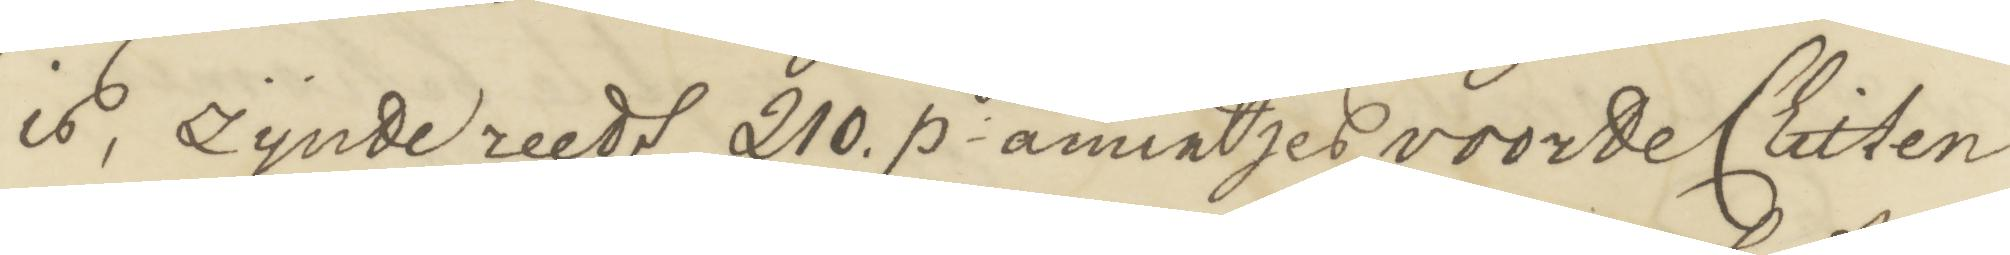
is, zijnde reeds 210. p=s amirtjes voor de Chitsen
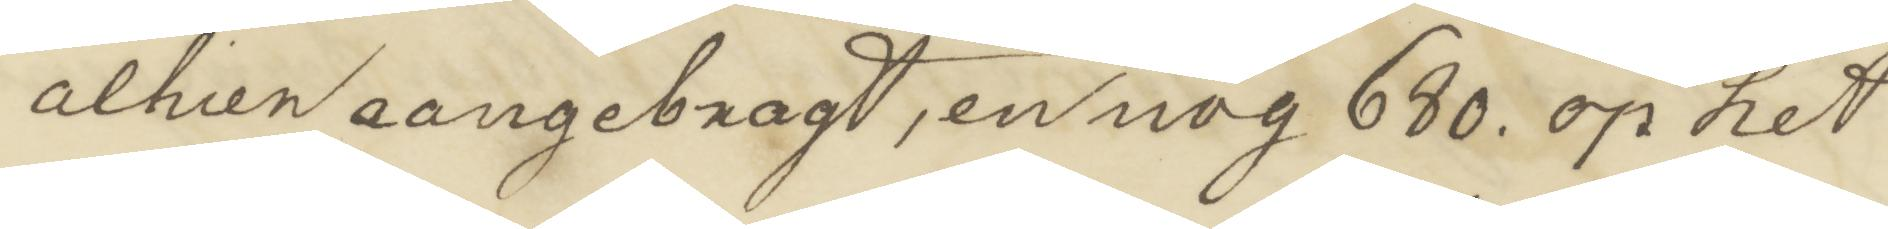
alhier aangebragt, en nog 680. op het
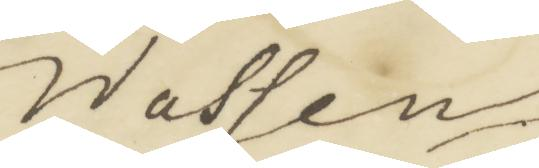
wassen
